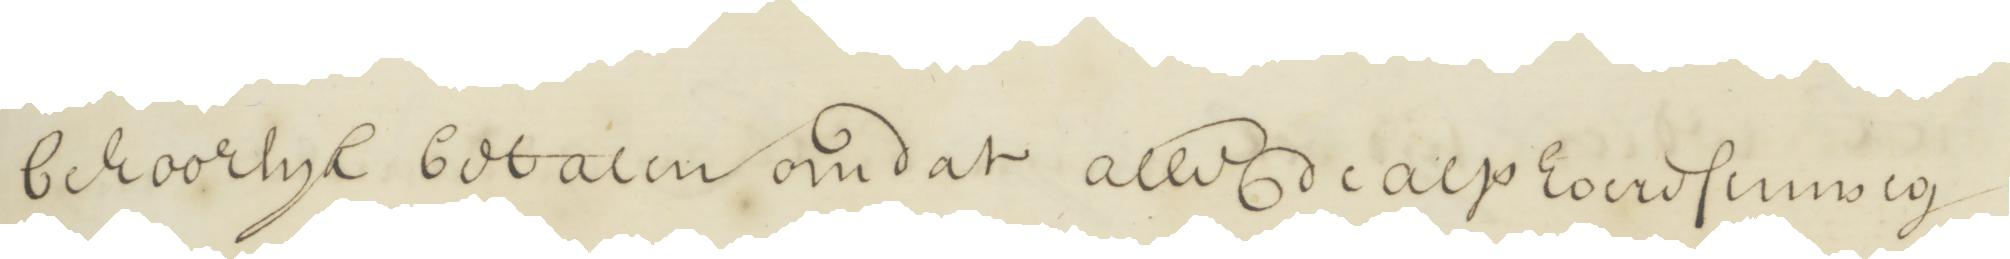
behoorlijk betalen omdat alle de alphoeresinweg
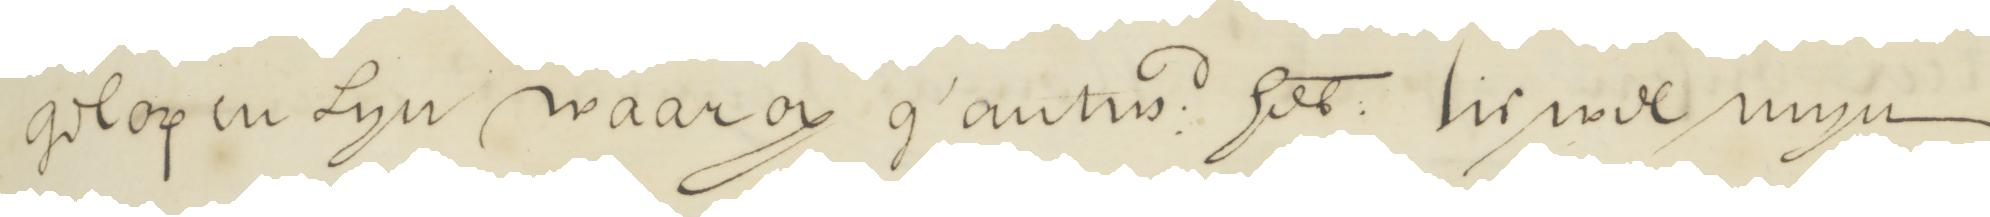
gelop en zijn waar op g’antw:d heb: tiswel myn
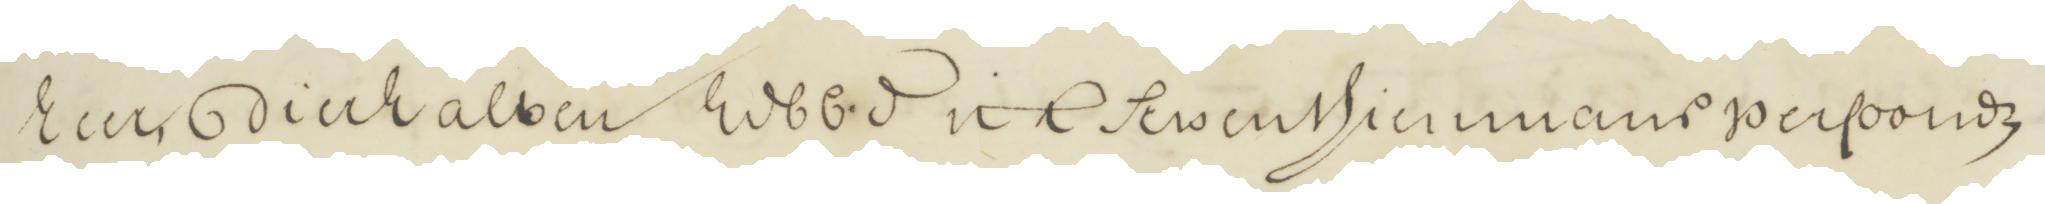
heer, dierhalven hebbe ick seventhienmans persoonen
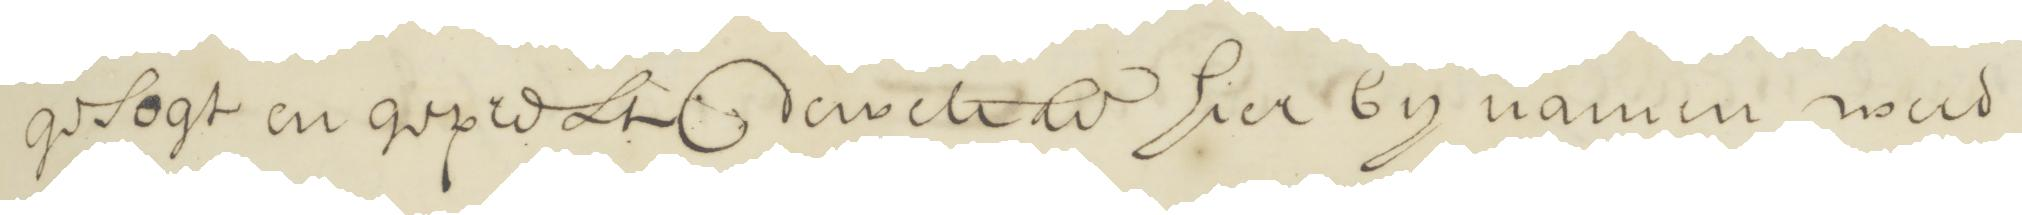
gesogt en geprest dewelcke hier bij namen werd
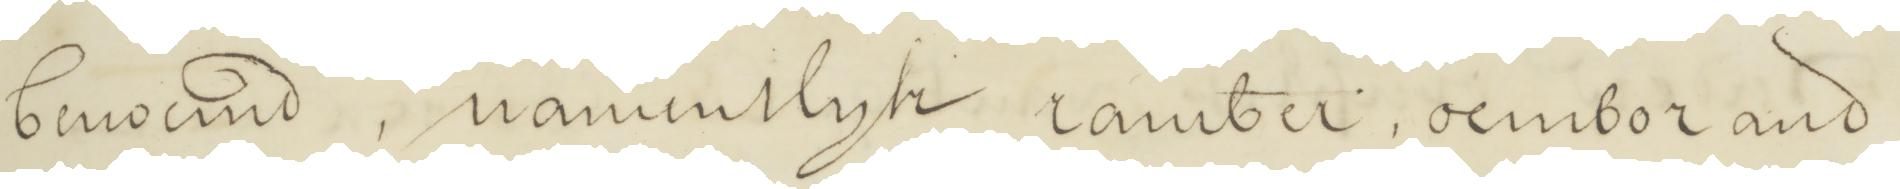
benoemd, namentlyk ramber, oembor and
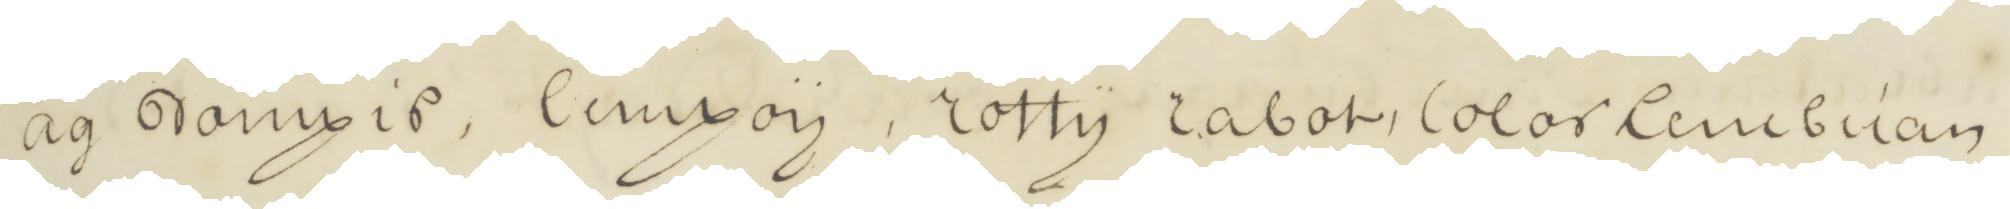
ag domp is, lempoij, rottij rabot, tolos cembuan
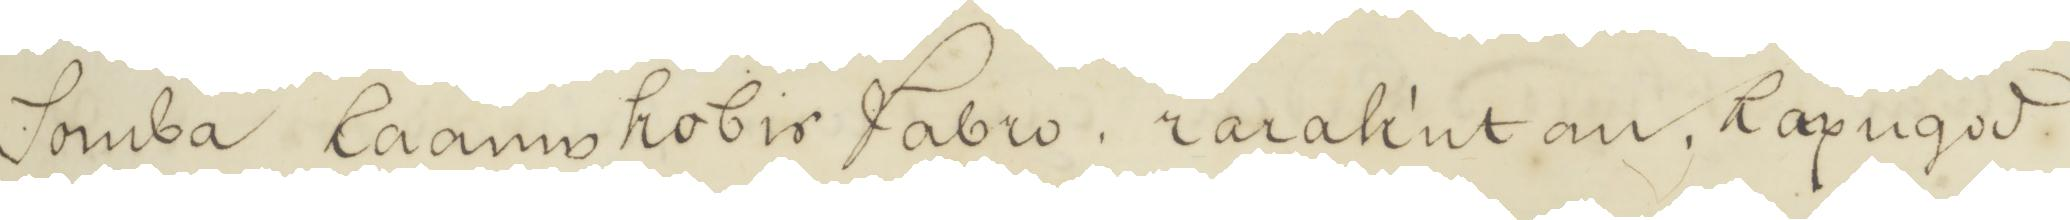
somba caauw kobis fabro, rarakut an, kapugoe
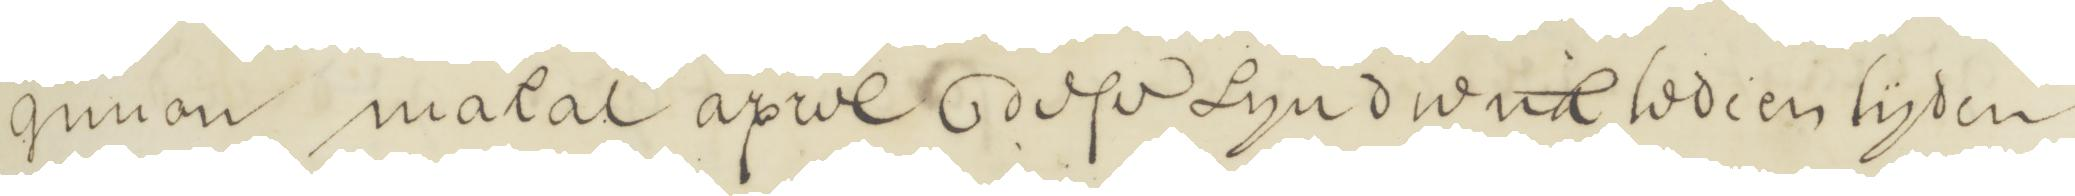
gimon makal aprel dese zijn die ick tedien tijden
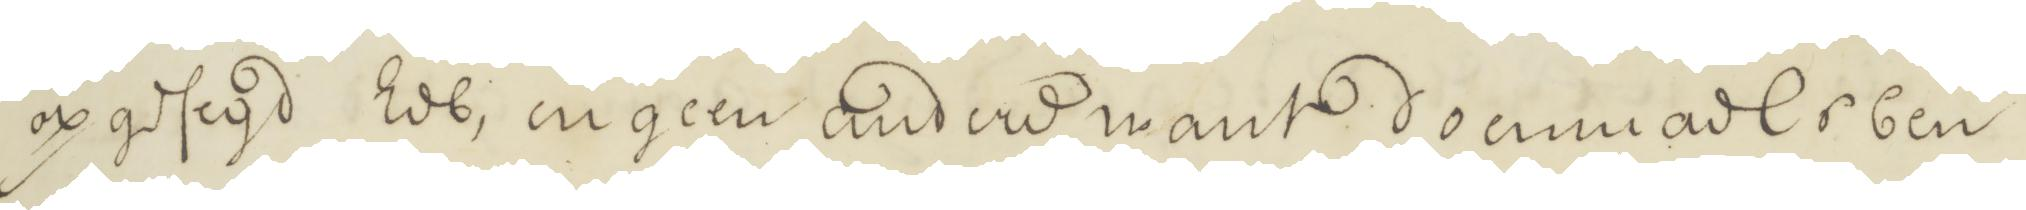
op gesegd heb, en geen andere want doenmaels ben
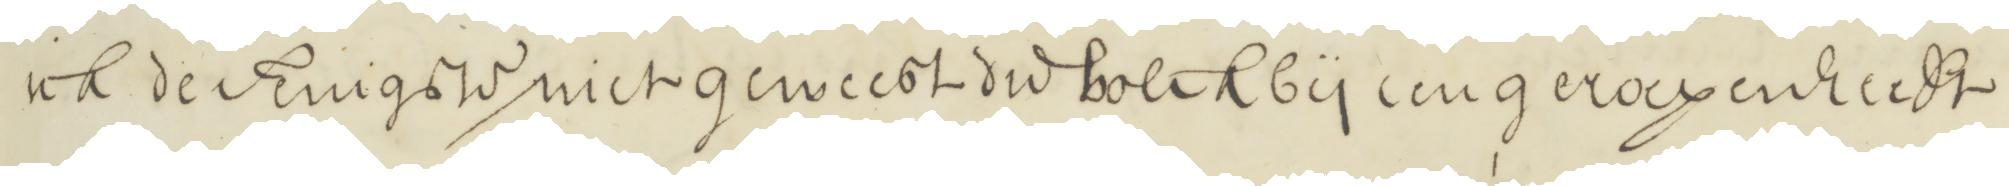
ick de eenigste niet geweest die volck bij een geroepenheeft
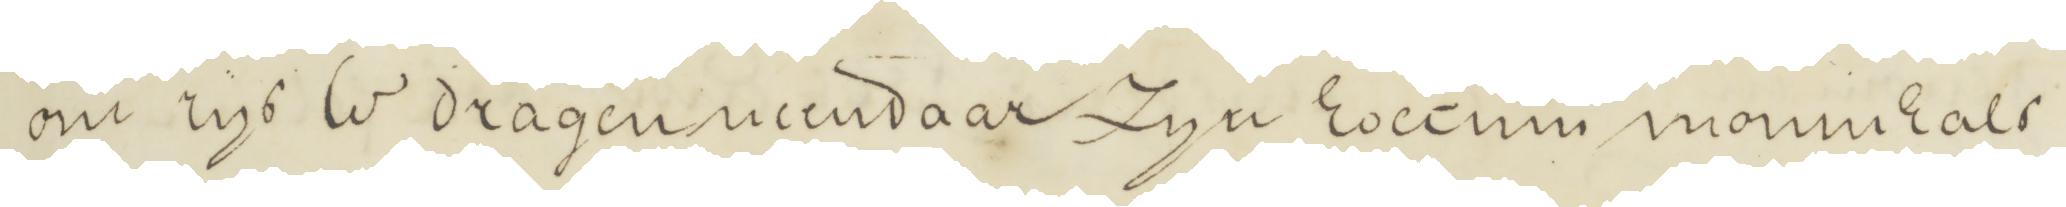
om rijs te dragen neendaar zijn hoecum moninhals
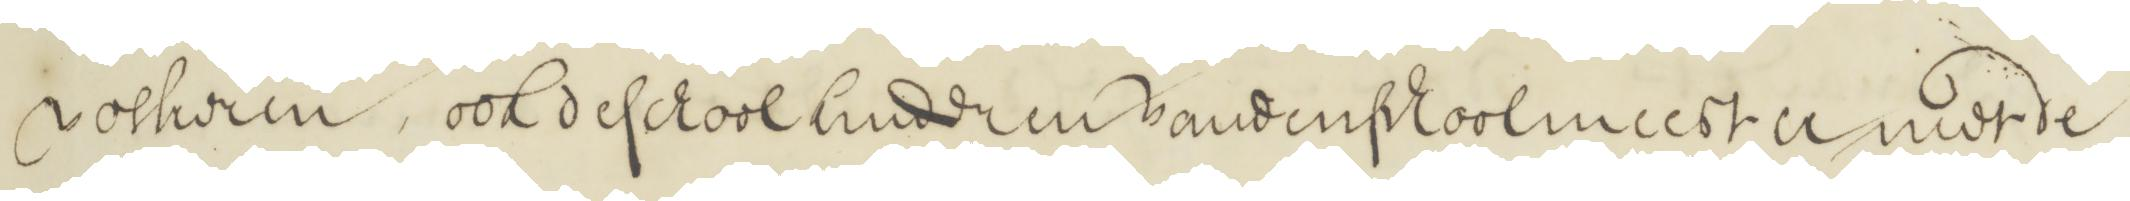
volkeren, ook deschool kinderen vanden schoolmeester met de
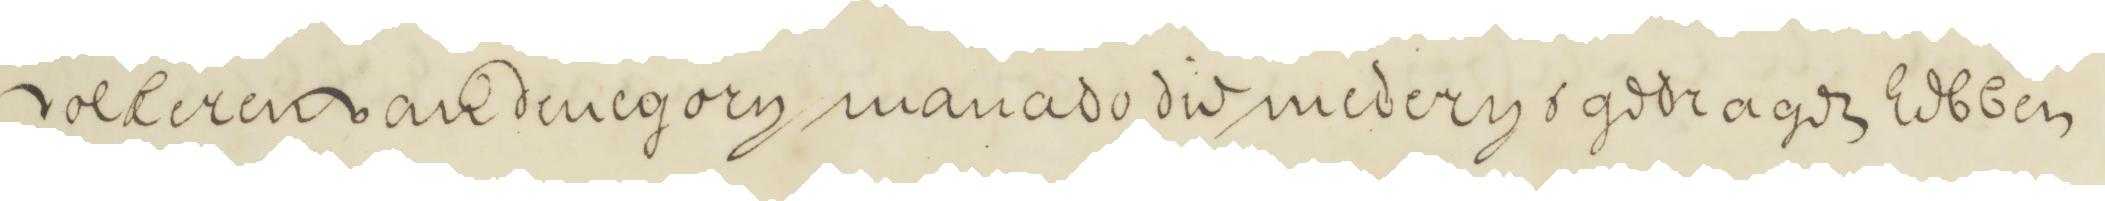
volkeren van denegory manado die mederijs gedragen hebben
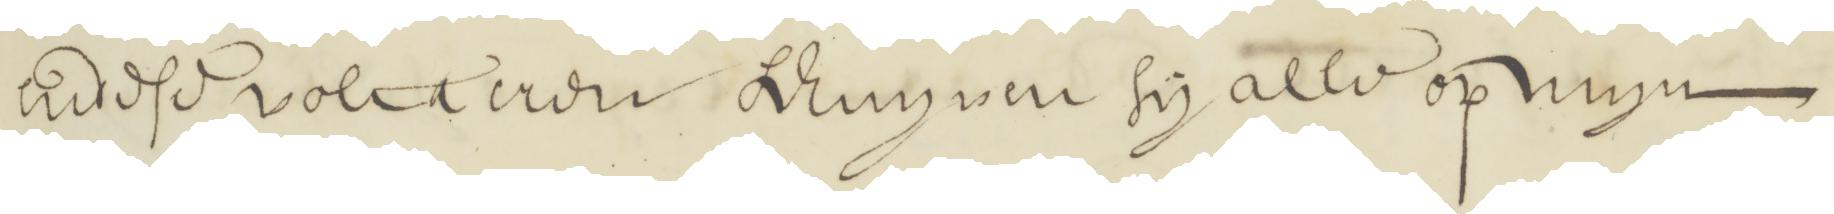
endese volckeren schuijven sij alle op myn
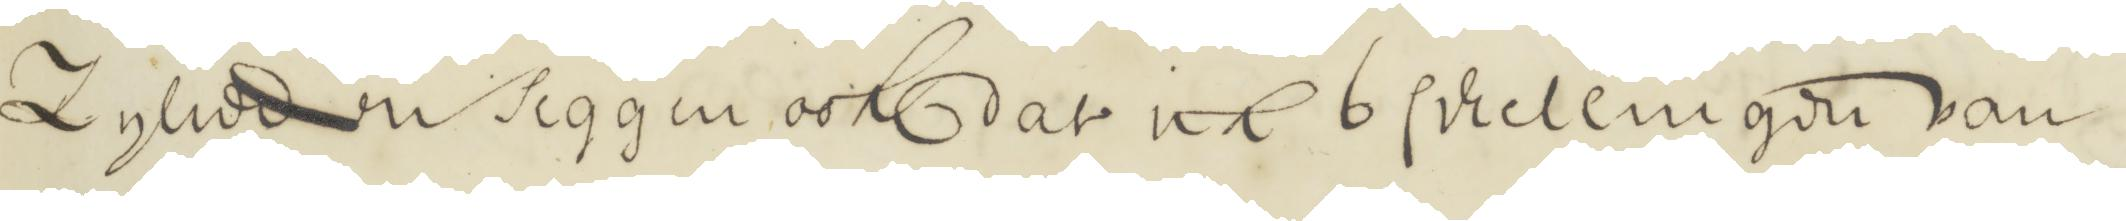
Zylieden seggen ook dat ick 6 schellingen van
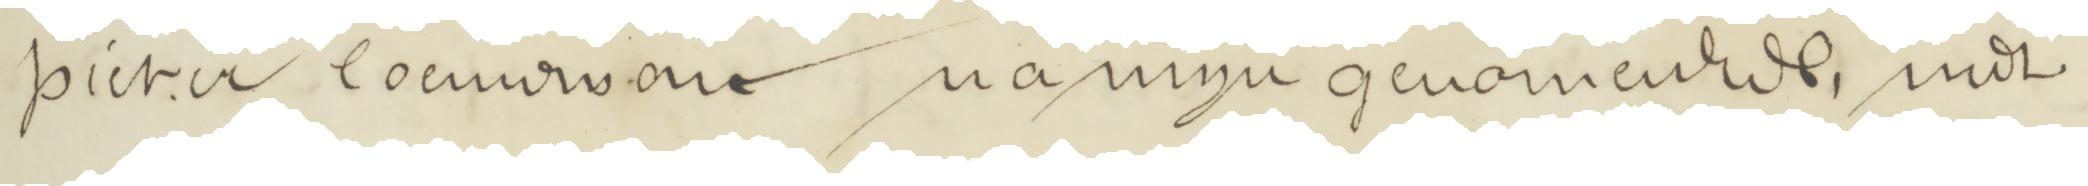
pieter loemewan na myn genomenheb, met
